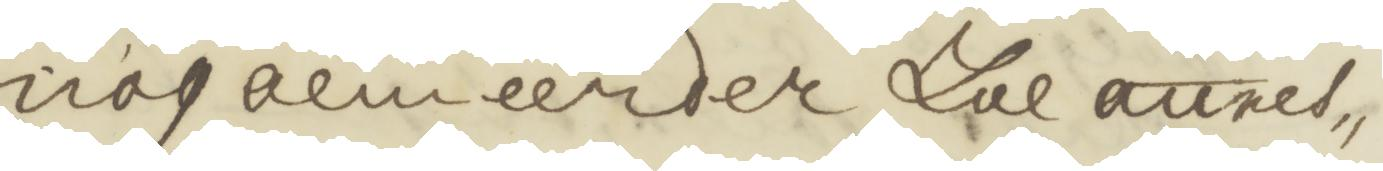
nog almeerder zal accres„
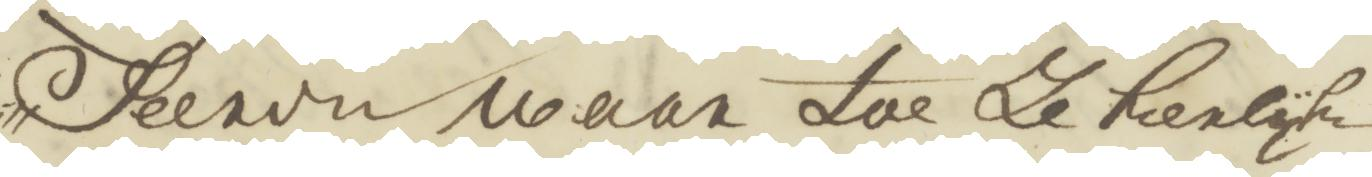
„seeren waar toe zekerlijk
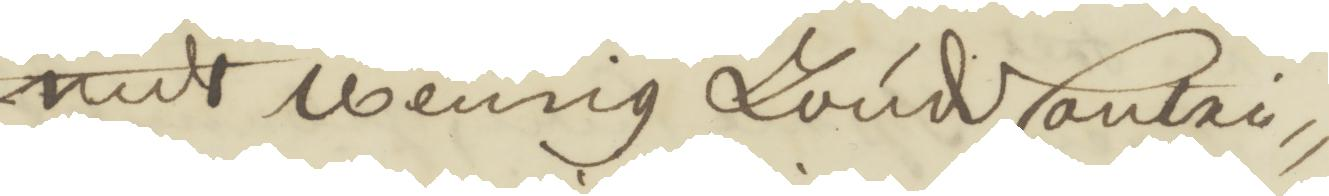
niet weinig zoude Contri„
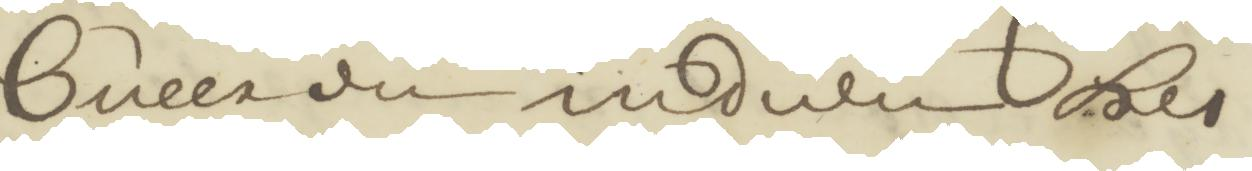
bueeren indien het
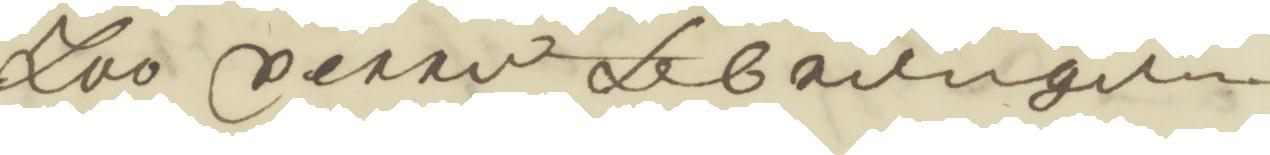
zoo verre te brengen
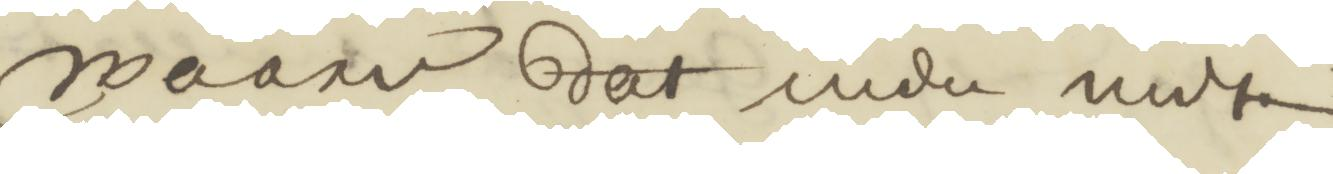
waare dat men met
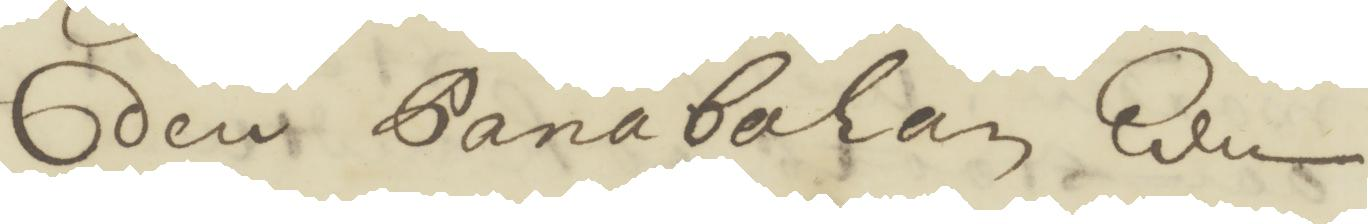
den Panabahan Een
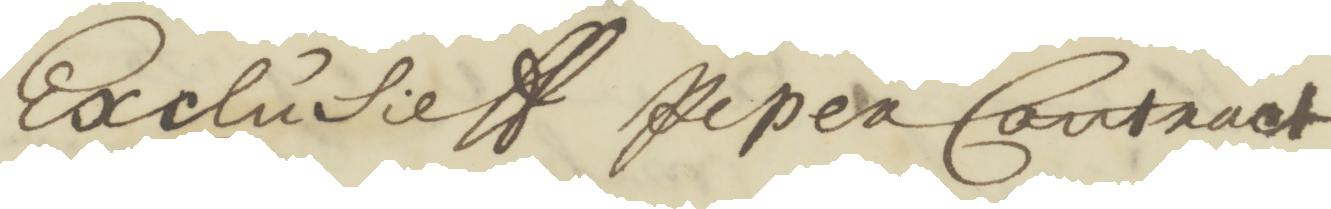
Exclusieff peper Contract
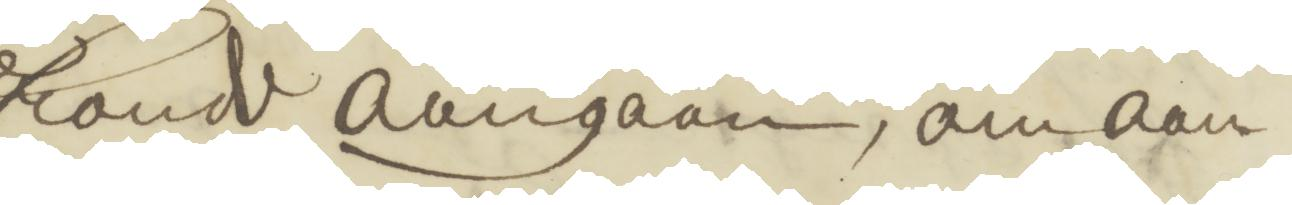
konde aangaan, om aan
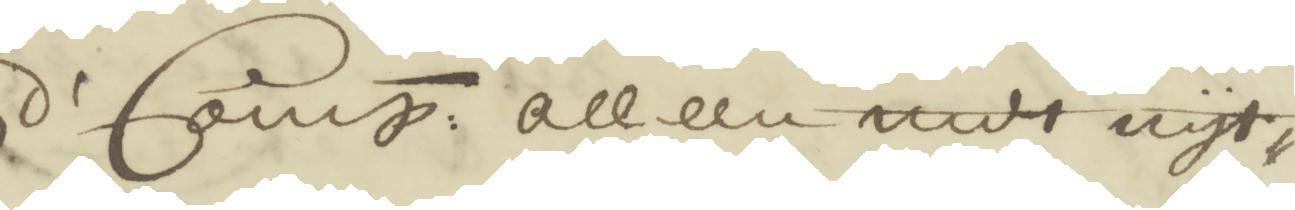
d' Comp: alleen met uijt
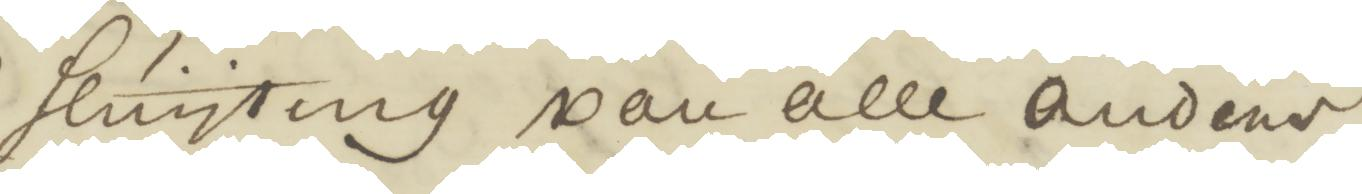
sluijting van alle andere
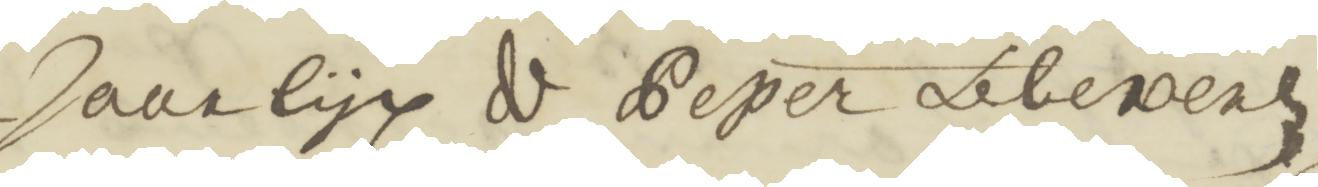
jaarlijx de Peper te leveren,
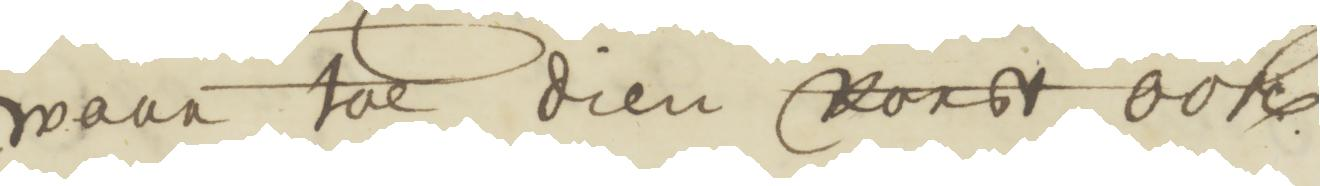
waar toe dien vorst ook.
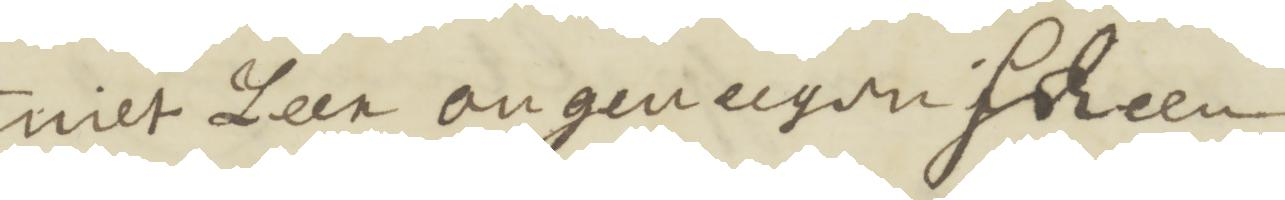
niet zeer ongeneegen scheen
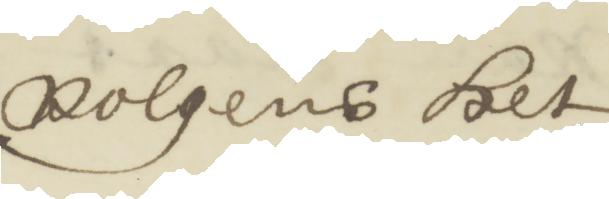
volgens het
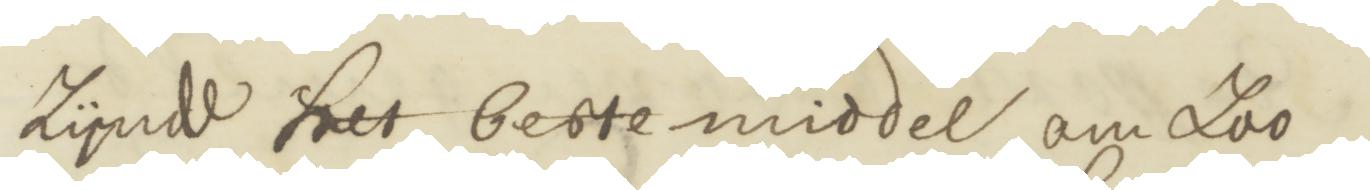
zijnde het beste middel om zoo
